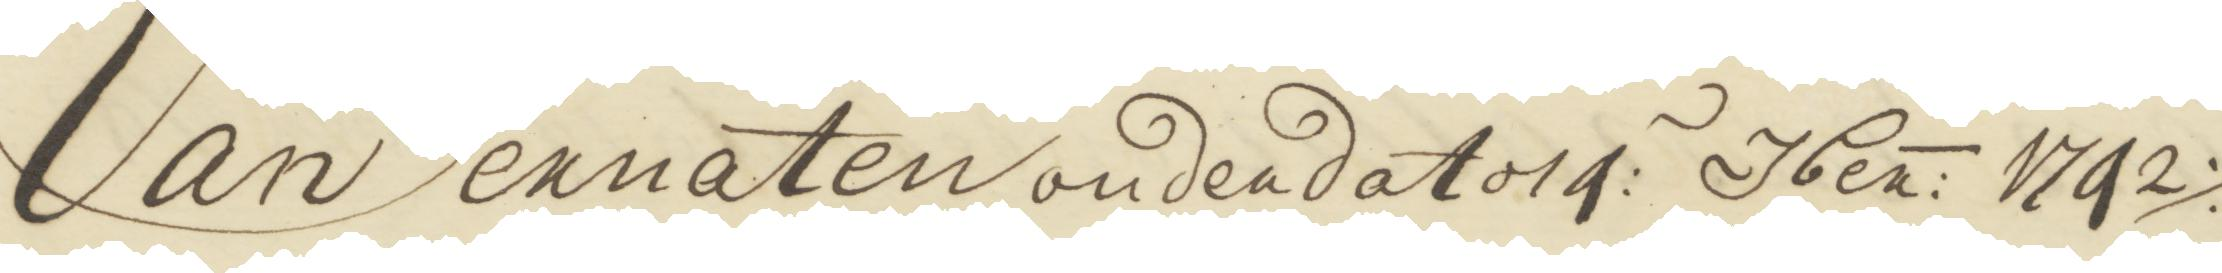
Van Ternaten onder dato14:' 7ber: 1742
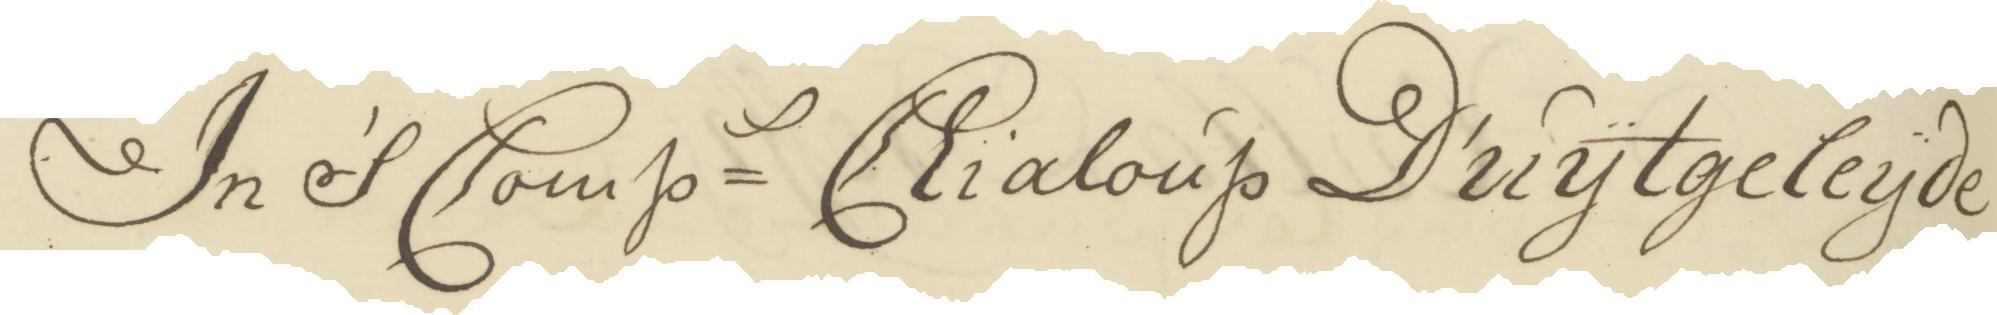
In 'S Comp=s Chialoup D'uijtgeleijde
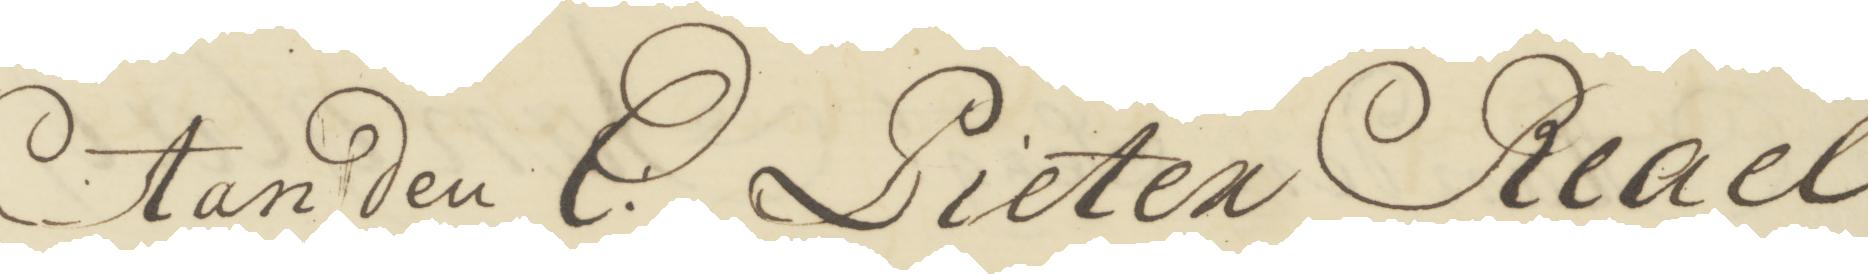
Aan den E: Pieter Reael
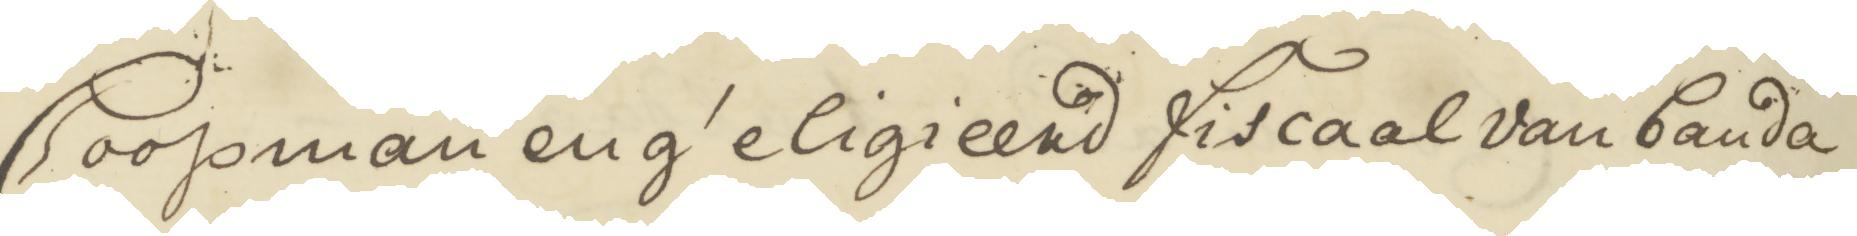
Coopman en g’eligieerd fiscaal van banda
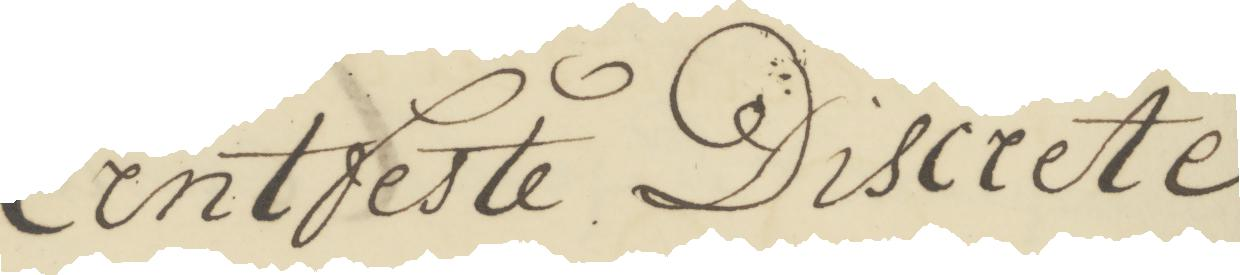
Erntfeste Discrete
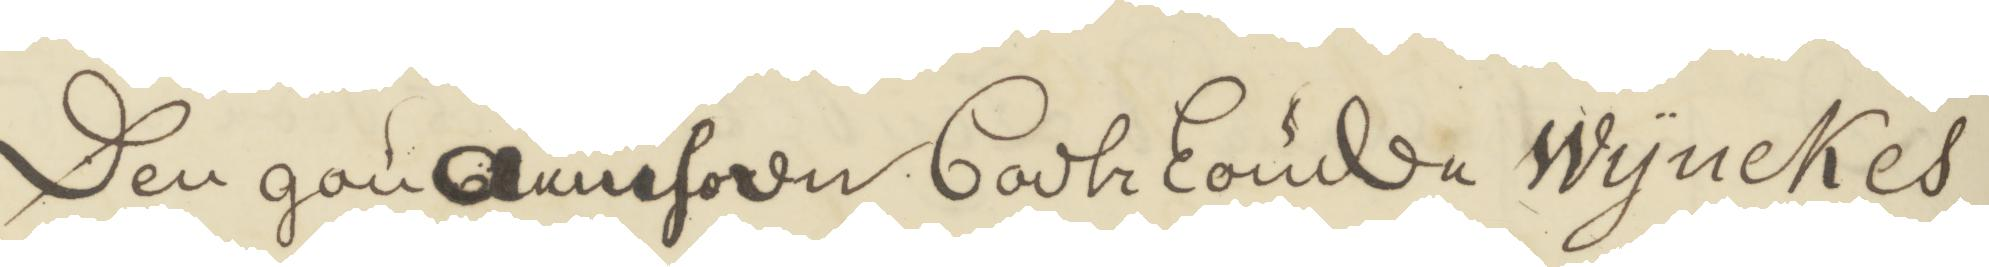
Den gouarnisoen boekhouder wijnekes
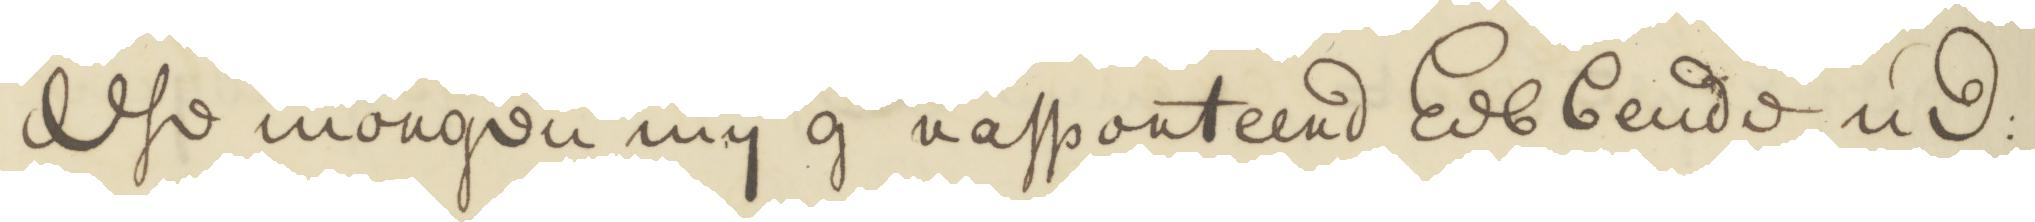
dese morgen mij g’rapporteerd hebbende uE:
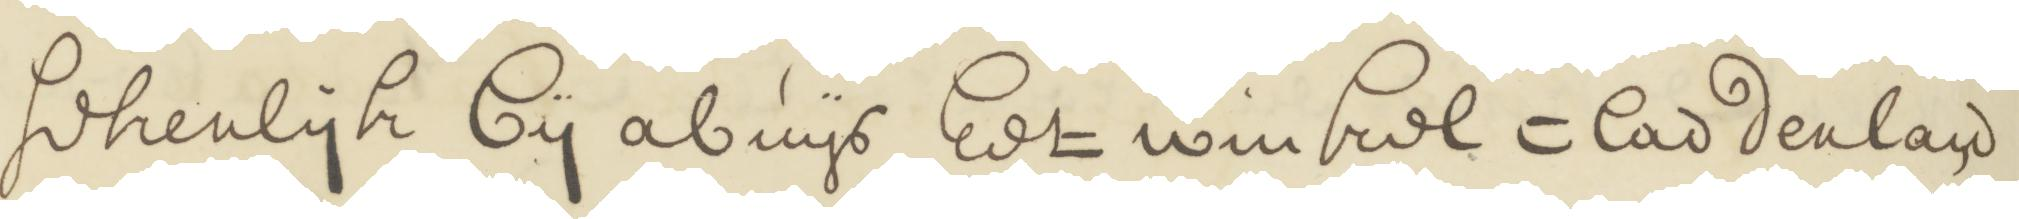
sekerlijk bij abuijs het winkel clad der land
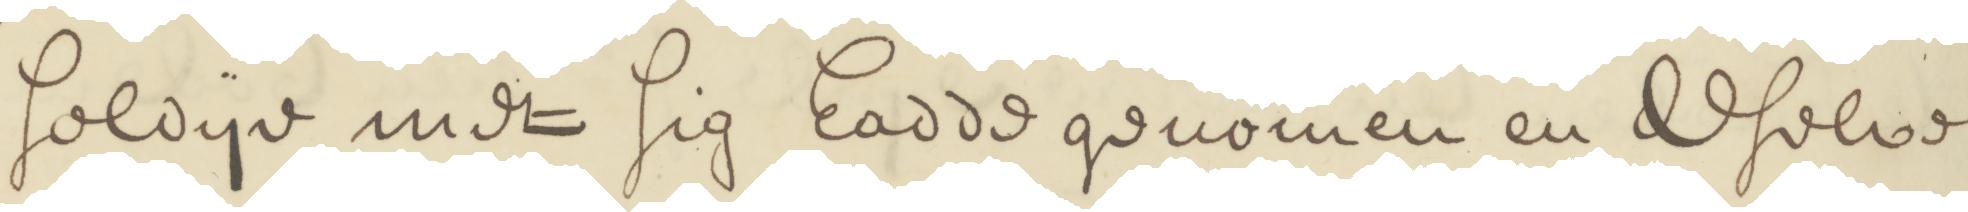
soldije met sig hadde genomen en deselve
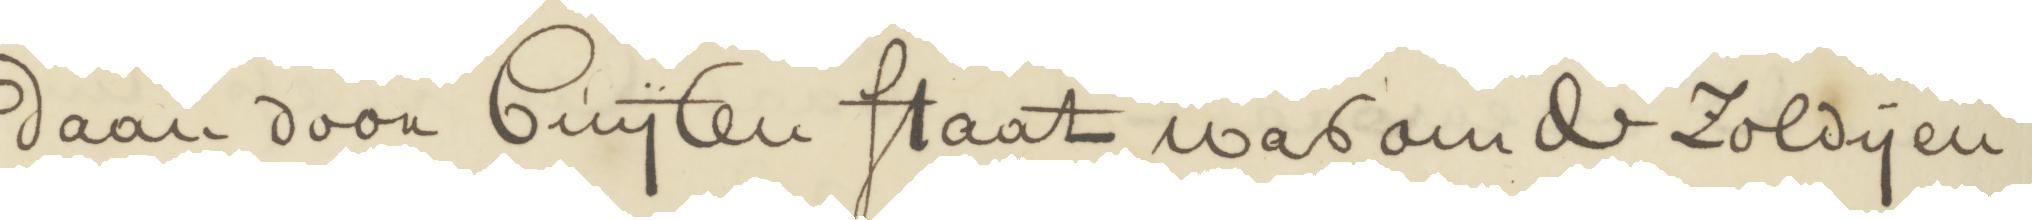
daan door buijten staat was om de zoldijen
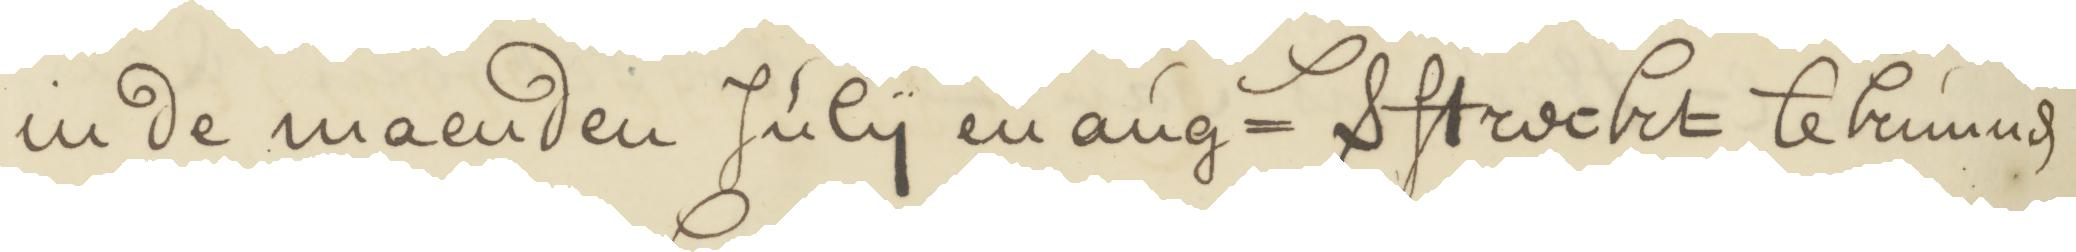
in de maenden Julij en aug=s verstreckt te kunnen
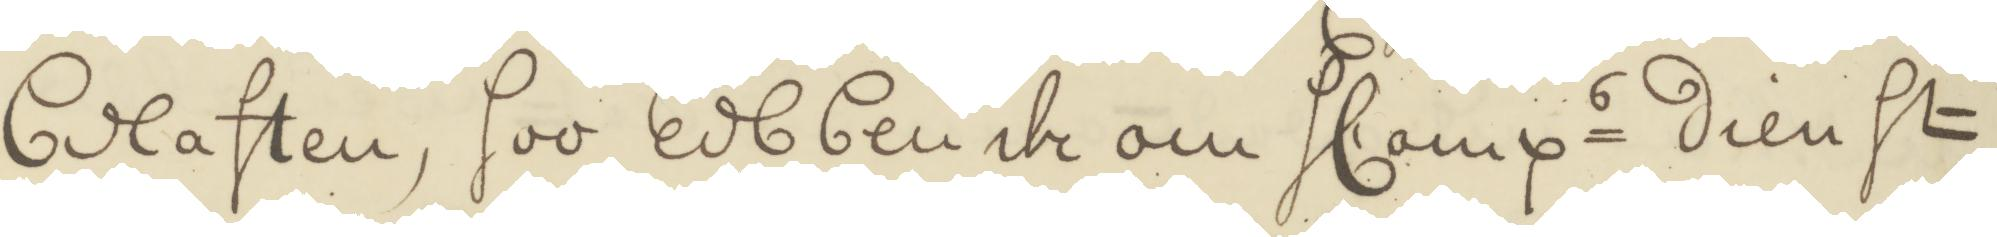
belasten, soo hebben ik om sComp=s dienst
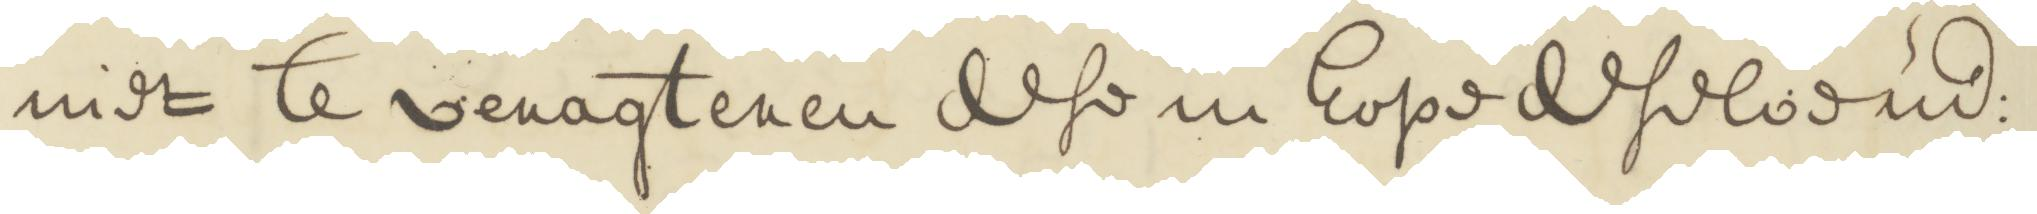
niet te veragteren dese in hope deselve uE:
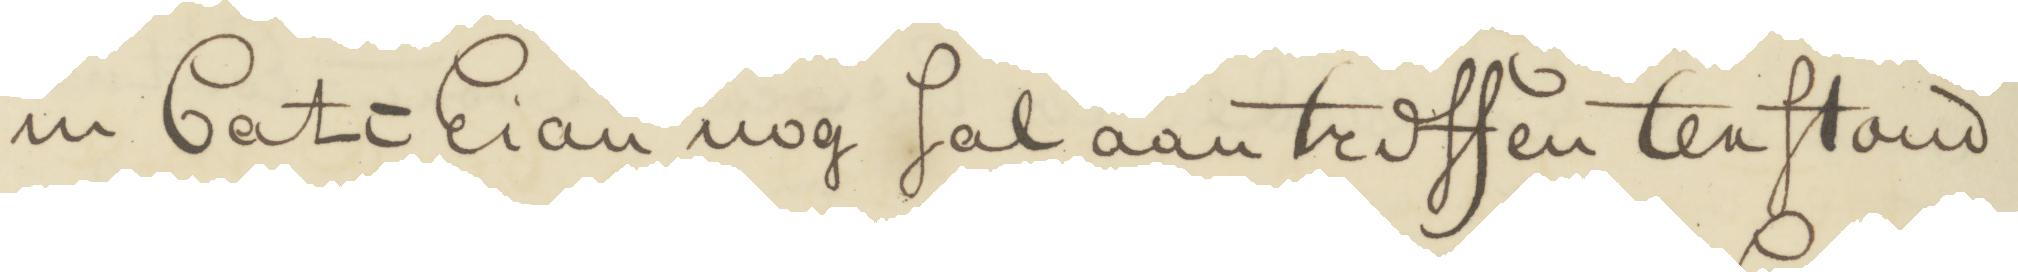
in batchian nog sal aan treffen terstond
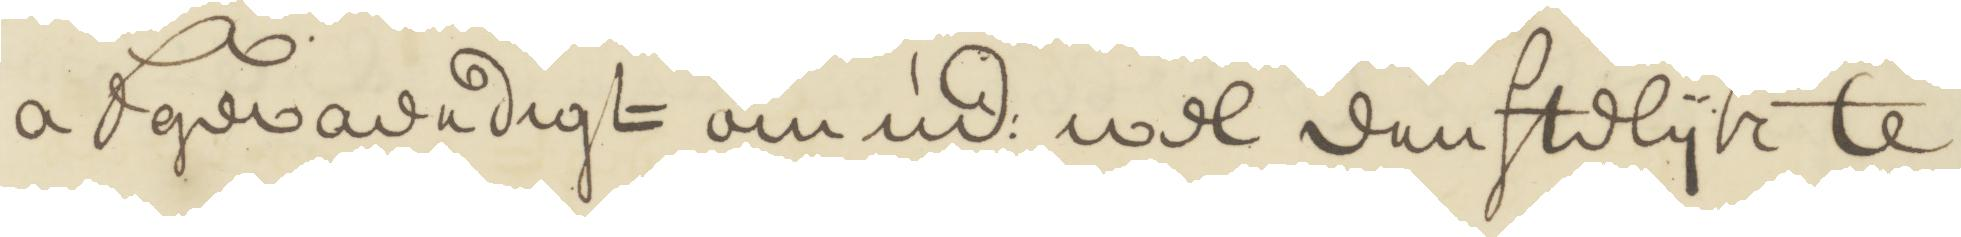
afgevaerdigt om uE: wel ernstelijk te
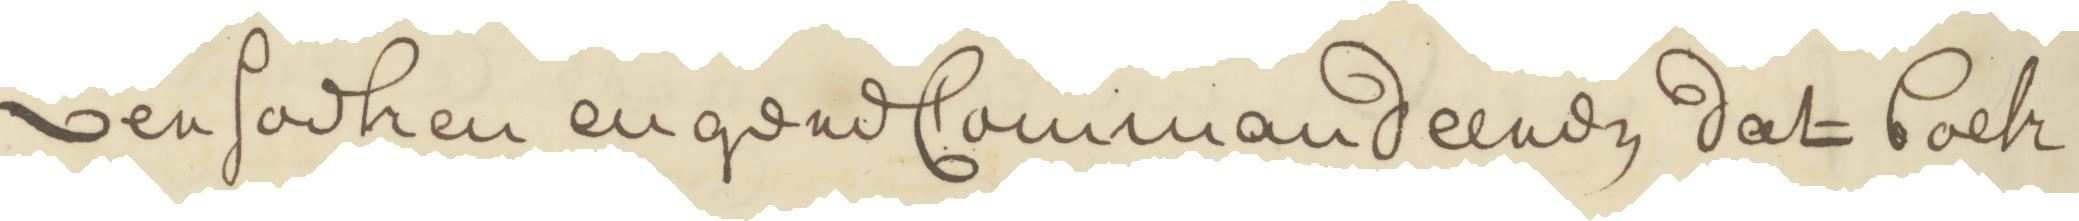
versoeken en gerecommandeeren dat boek
